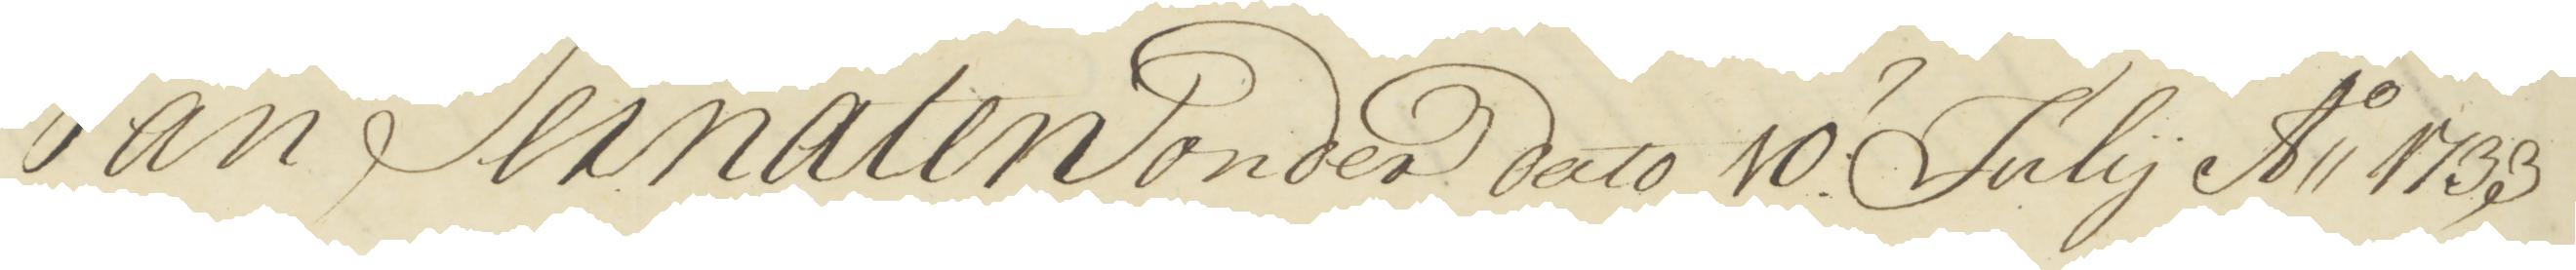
Van Ternaten onder dato 10:' Julij A„o 1733
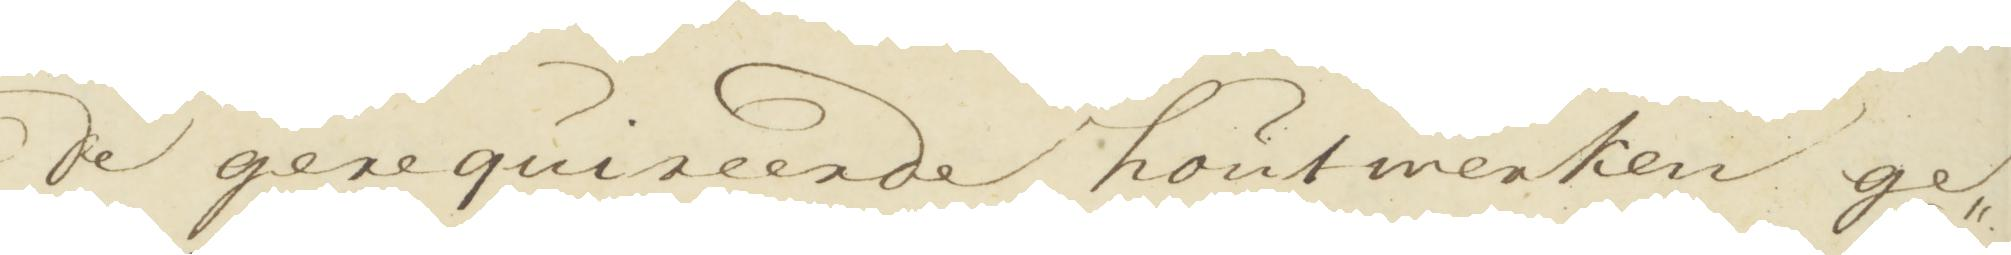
de gerequireerde houtwerken ge„
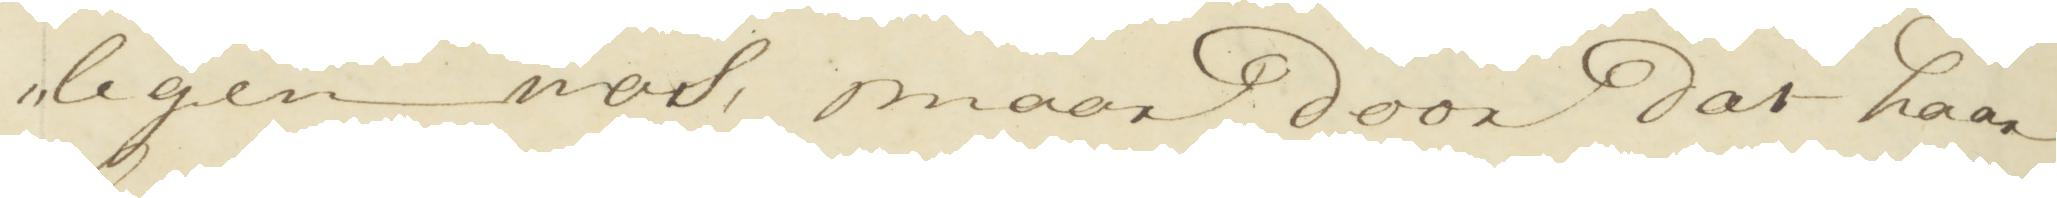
„legen was, maar door dat haar
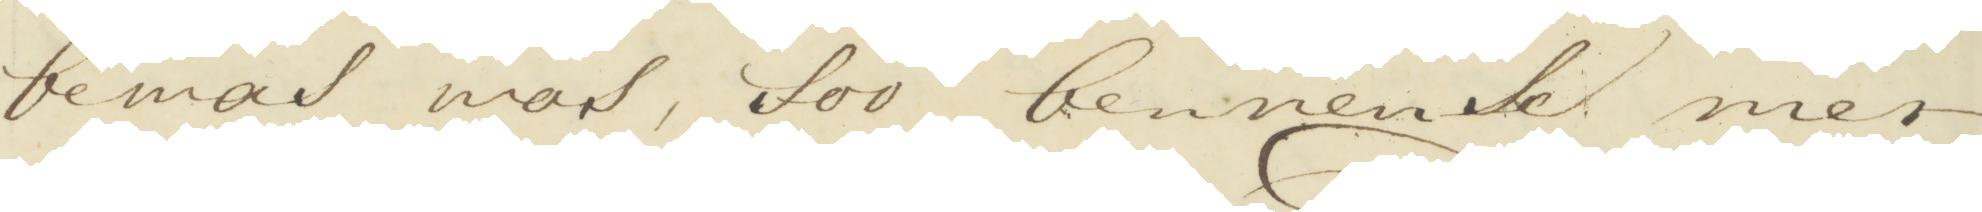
bewas was, soo bennen se niet
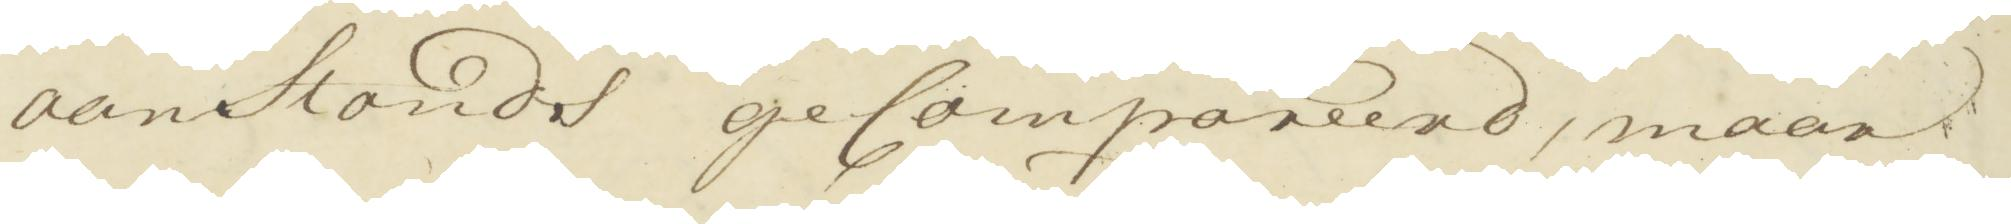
aanstonds gecompareerd, maar
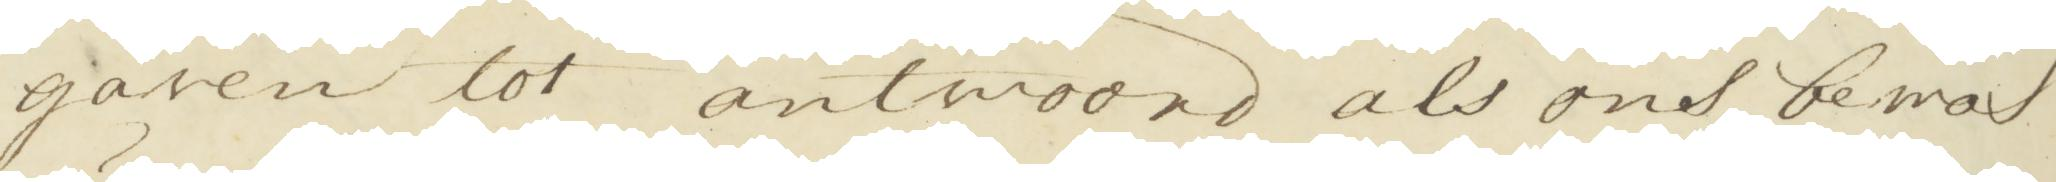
gaven tot antwoord als ons bewas
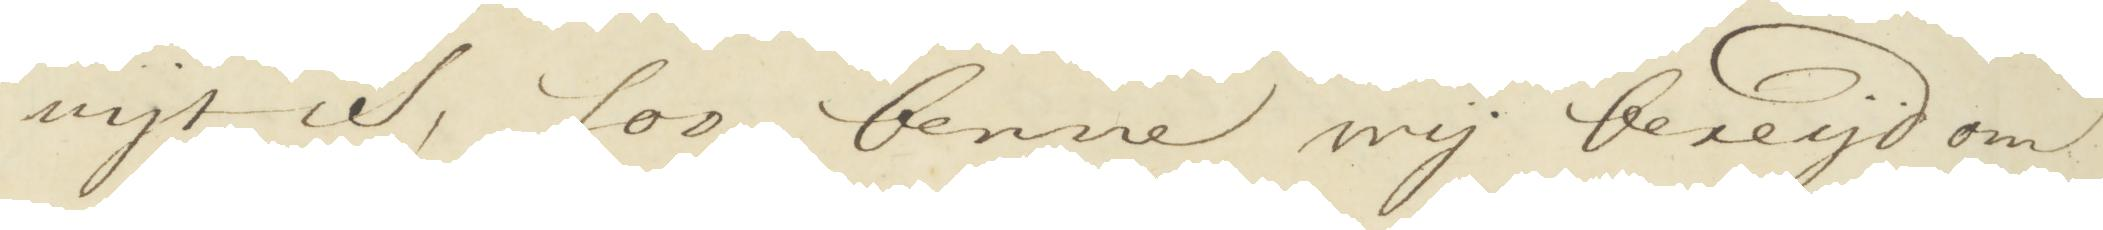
uijt is, soo benne wij bereijd om
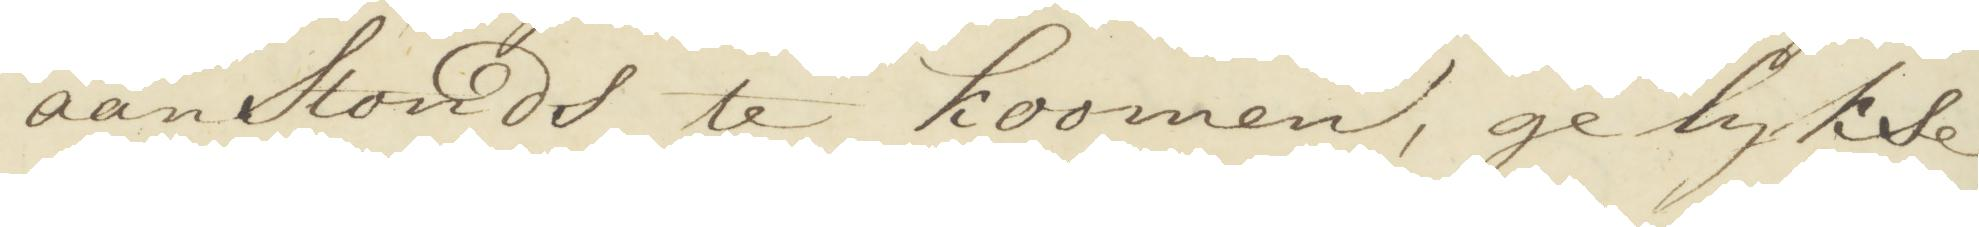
aanstonds te koomen, gelykse
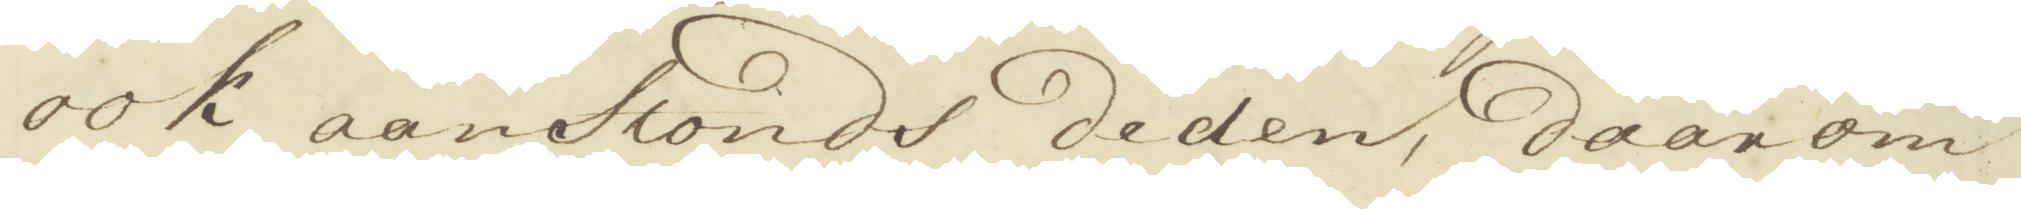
ook aanstonds deden, daar om
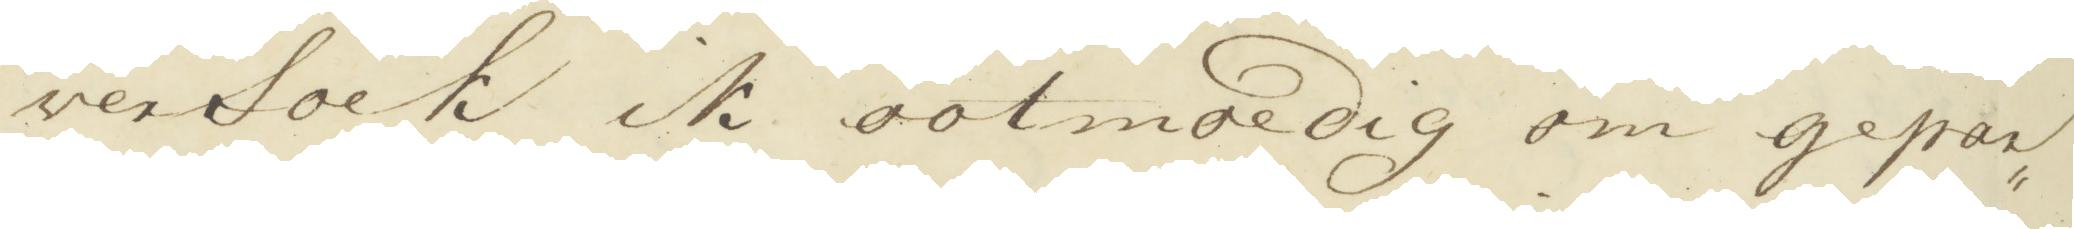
versoek ik ootmoedig om gepar„
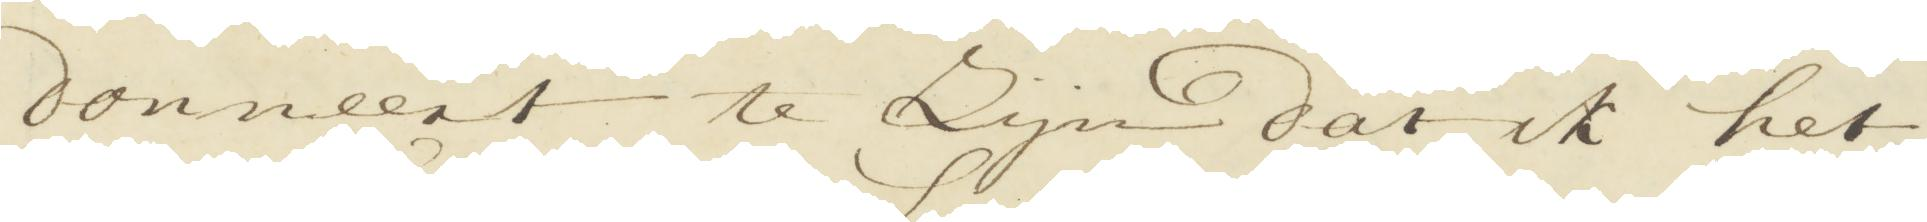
donneert te zijn dat ik het
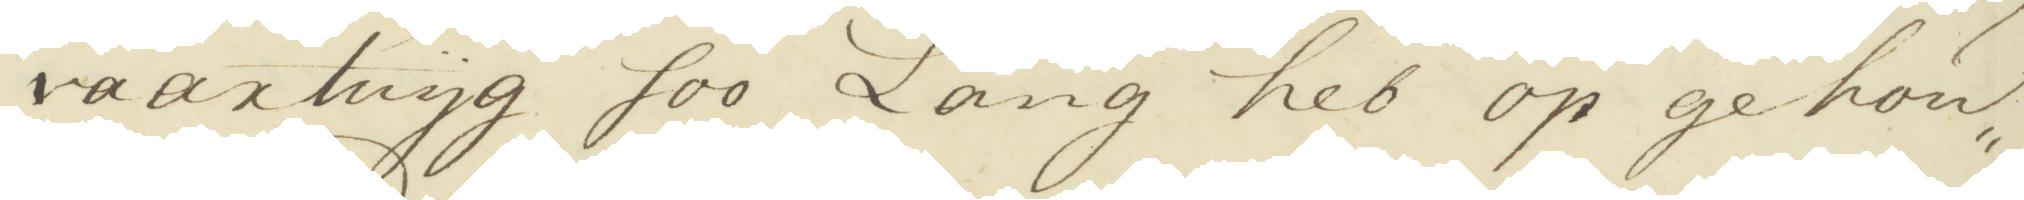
vaartuijg soo Lang heb op gehou„
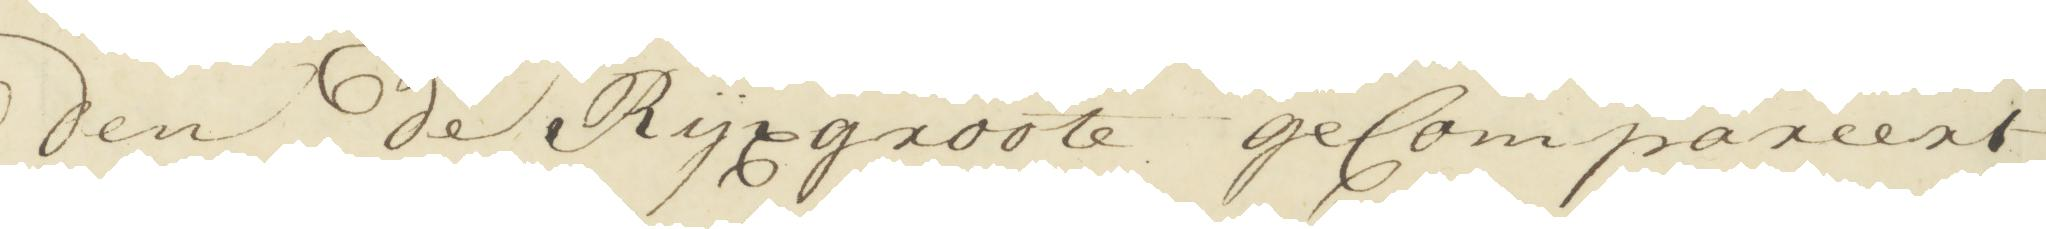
den de Rijxgroote gecompareert
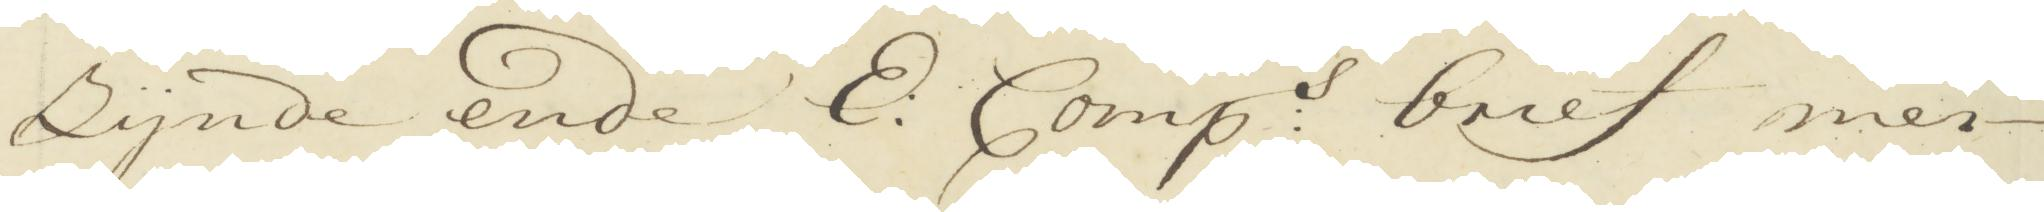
zijnde ende E: Comp:s brief met
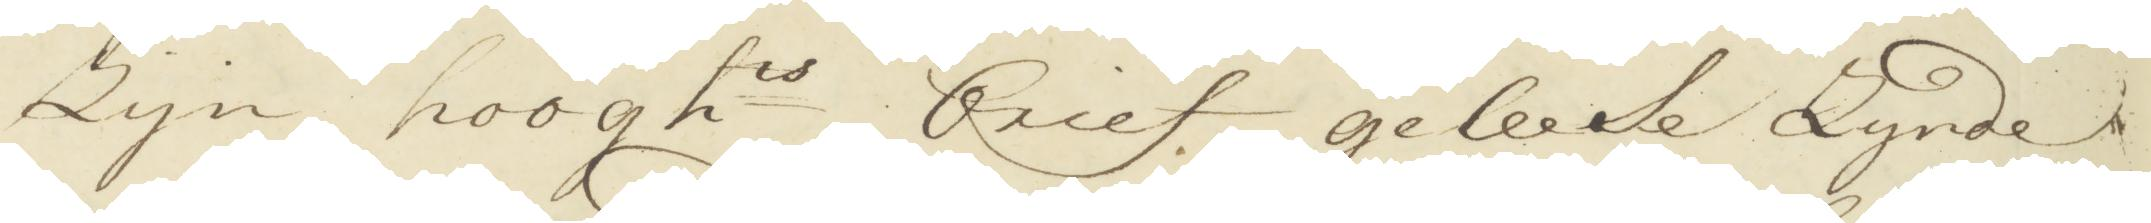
zijn hoogh=ts brief geleese zynde
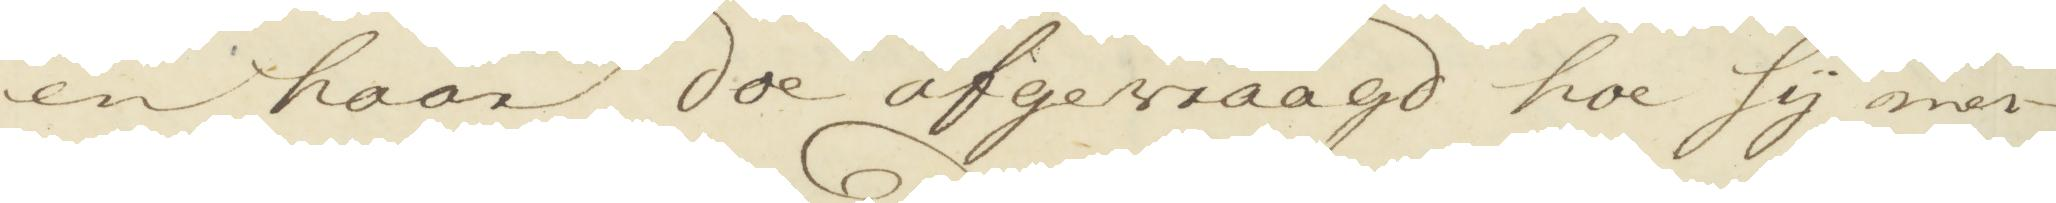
en haar doe afgevraagd hoe sij met
